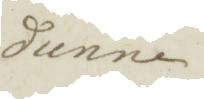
dunne
